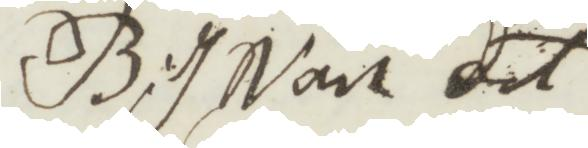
B:J van det
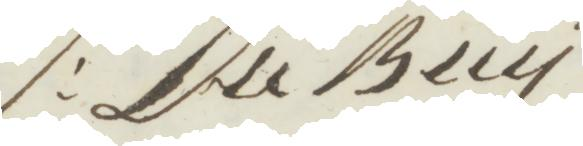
J: Du Buij
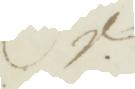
br.
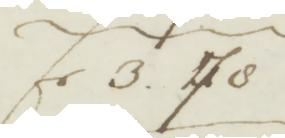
fr 3. 78
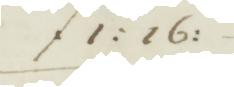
ƒ 1: 16: —
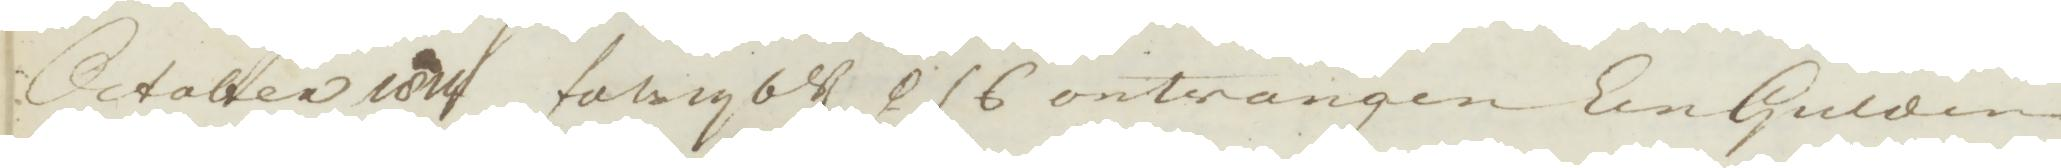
October 1814 folio 196 V 9 C 6 ontvangen Een Gulden
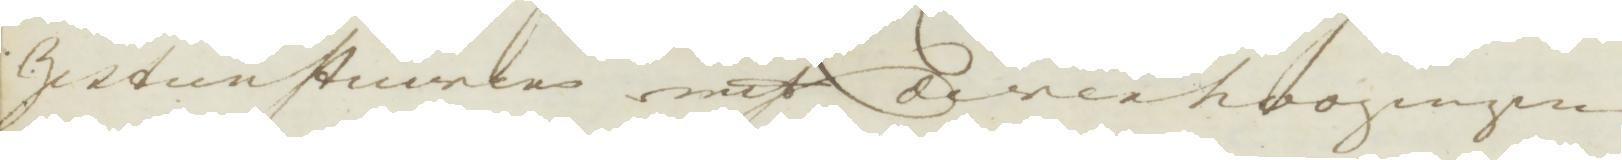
Zestien stuivers met de verhoogingen
